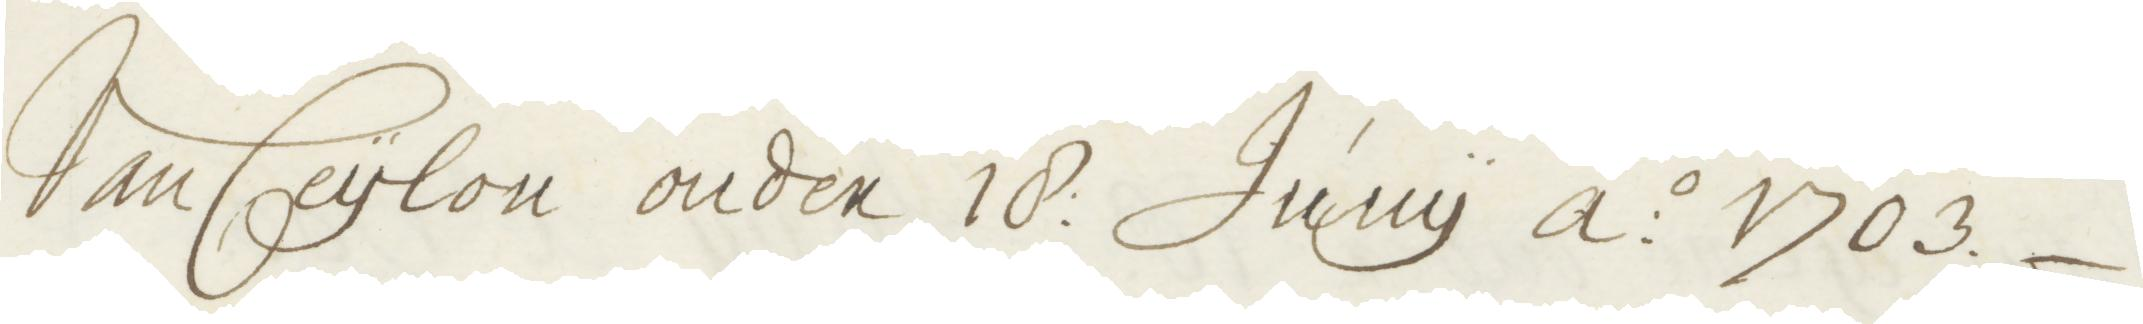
Van Ceijlon onder 18: Junij a:o 1703. —
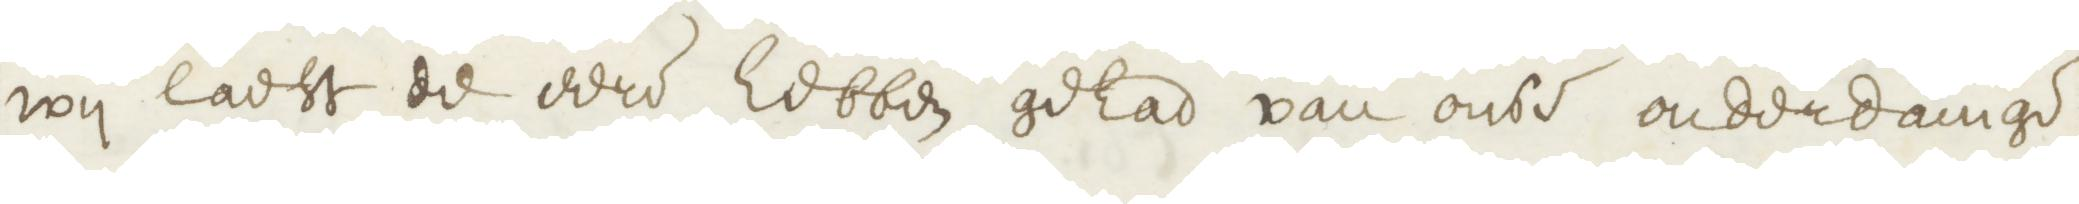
wij laest de eere hebben gehad van onse onderdanige
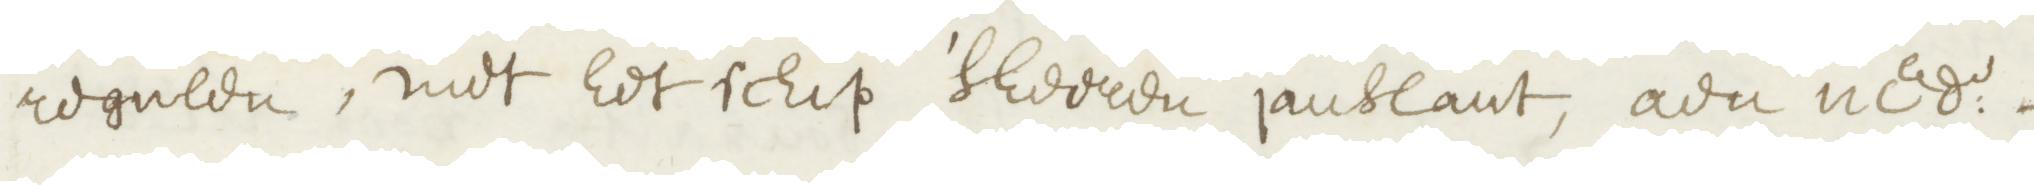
regulen, met het schip 'sheeren janslant, aen uEd:e
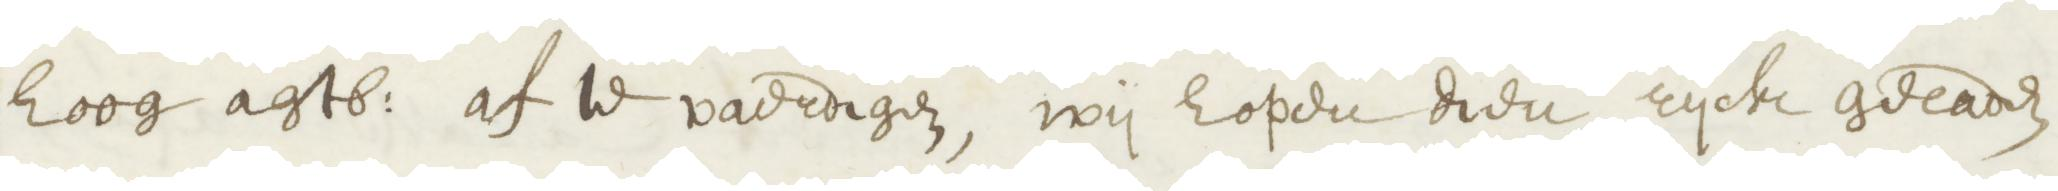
hoog agtb: af te vaerdigen, wij hopen dien rijck geladen
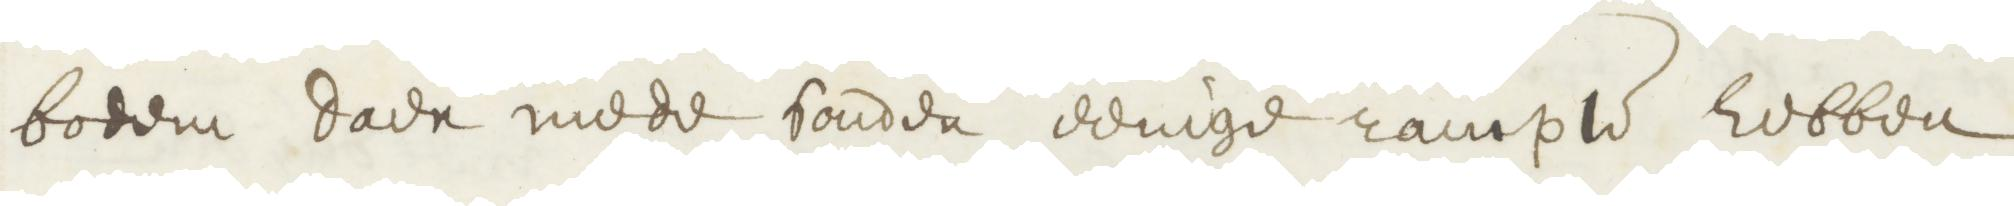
bodem daer mede sonder eenige ramp te hebben
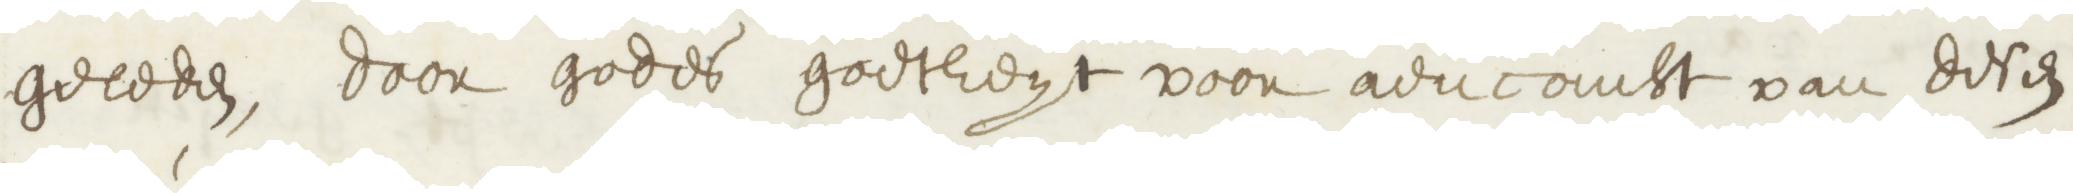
geleden, door godes goetheijt voor aencomst van desen
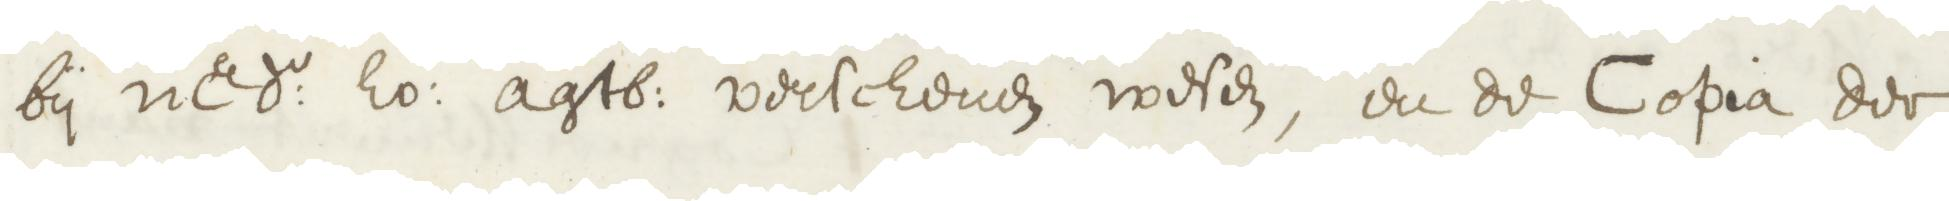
bij uEd:e ho: agtb: verschenen wesen, en de Copia der
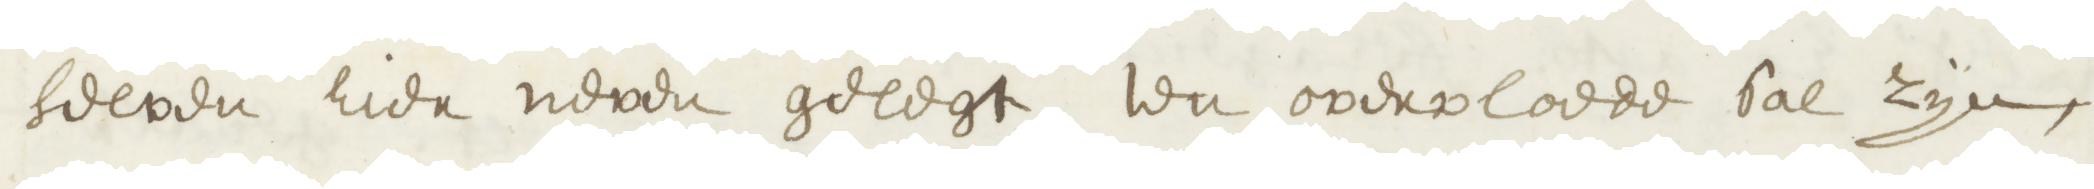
selven hier neven gelegt, ten overvloede sal zijn,
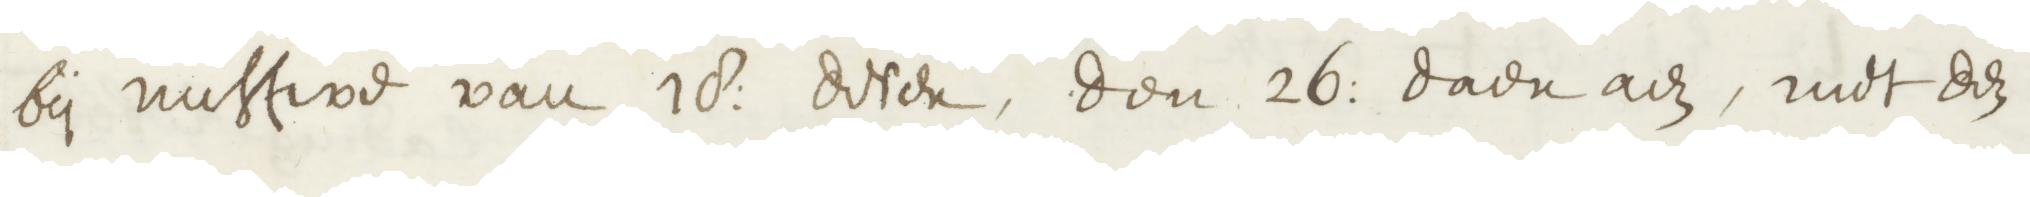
bij missive van 18: deser, den 26: daer aen, met den
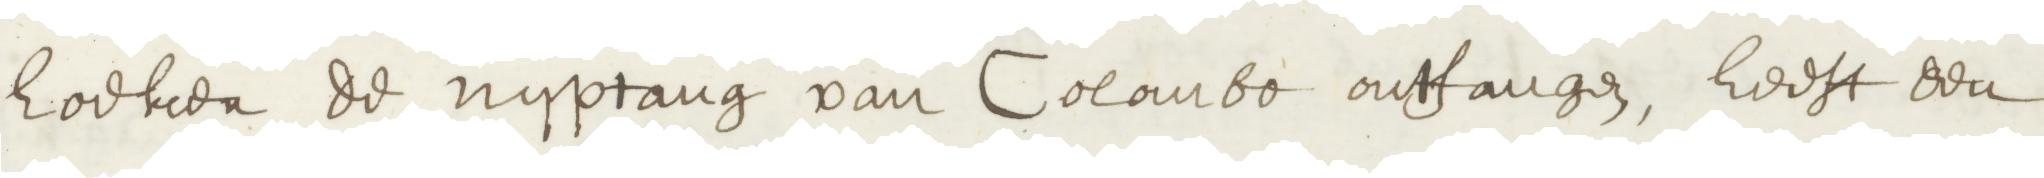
hoeker de nijptang van Colombo ontfangen, heeft den
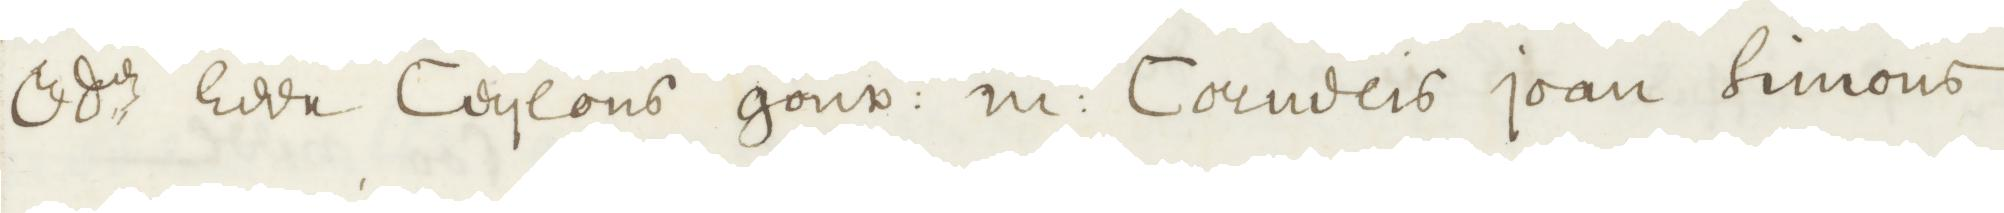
Ed„e heer Ceijlons gouv:r m:r Cornelis joan simons
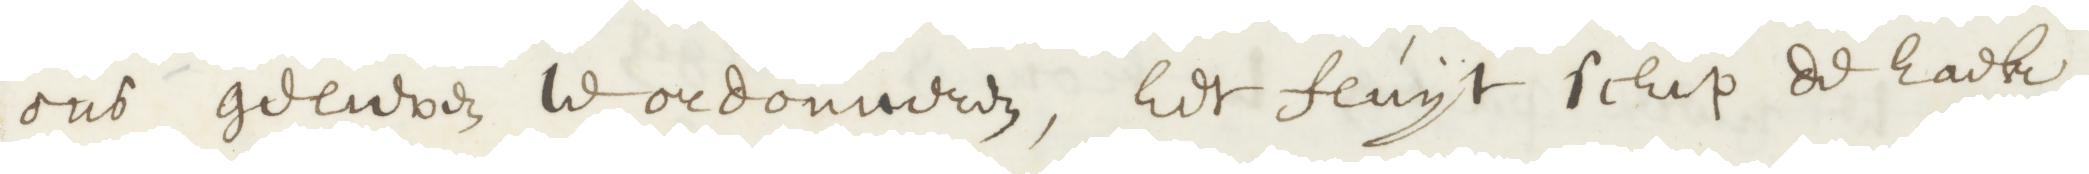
ons gelieven te ordonneren, het fluijt schip de haek,
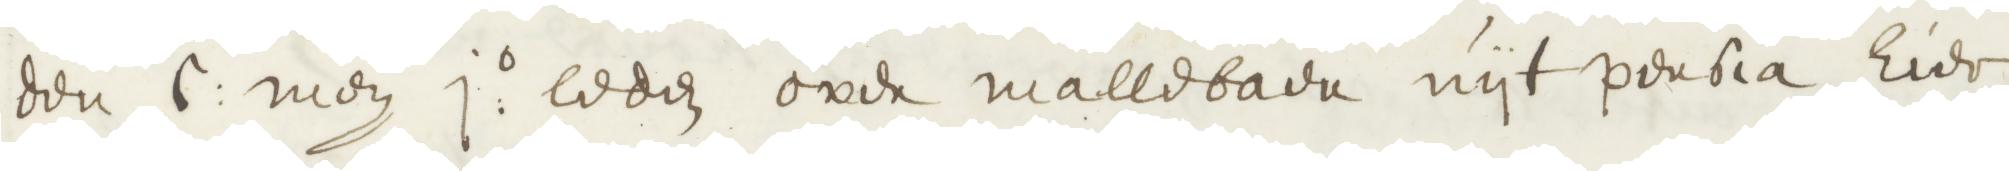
den 5: meij j:o leden over mallebaer uijt persia hier
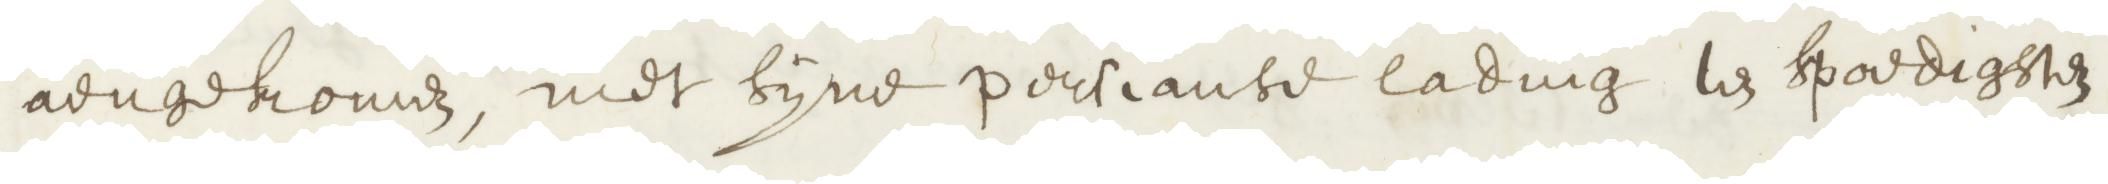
aengekomen, met sijne persianse lading ten spoedigsten
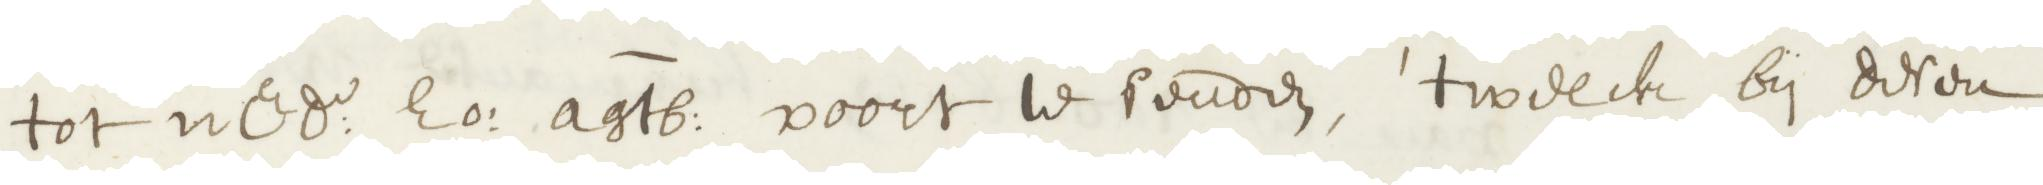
tot uEd:e ho: agtb: voort te senden, 'twelck bij desen
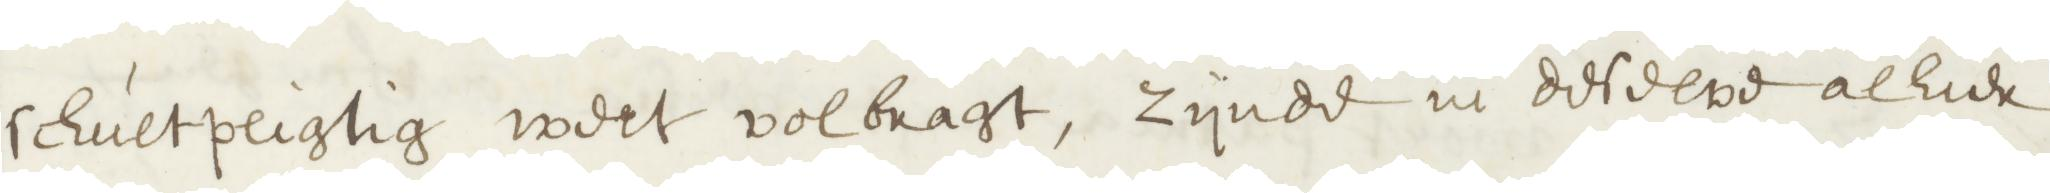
schultpligtig wert volbragt, zijnde in deselve alhier
